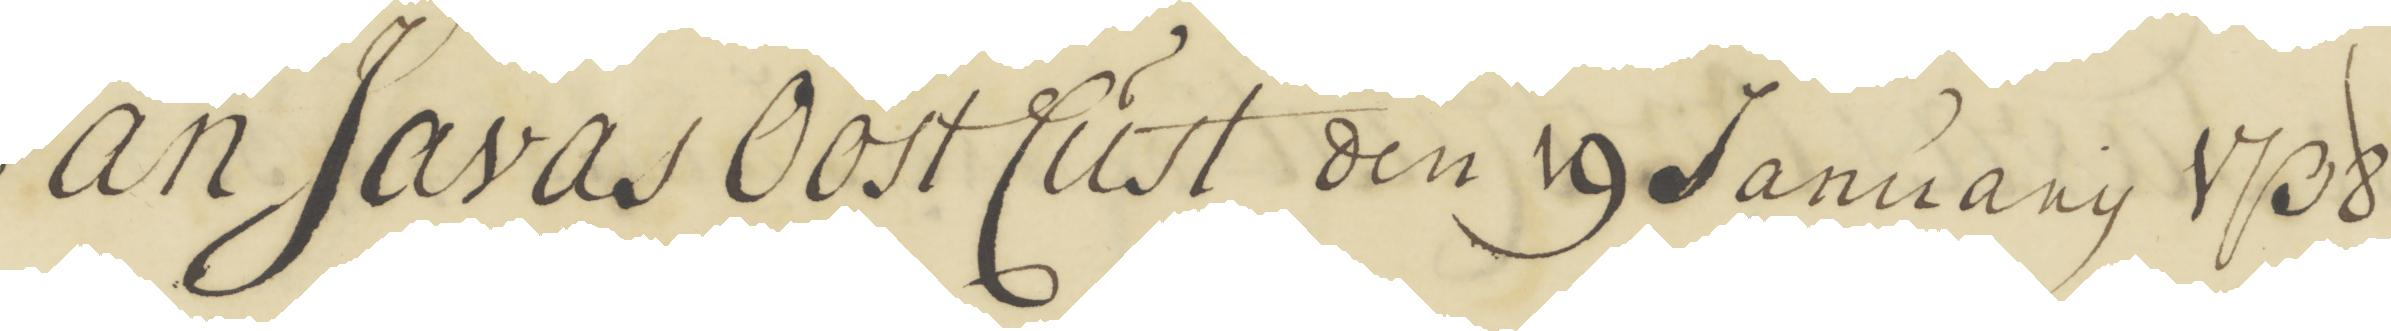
Van Javas Oost Cust den 19 Ianuarij 1738
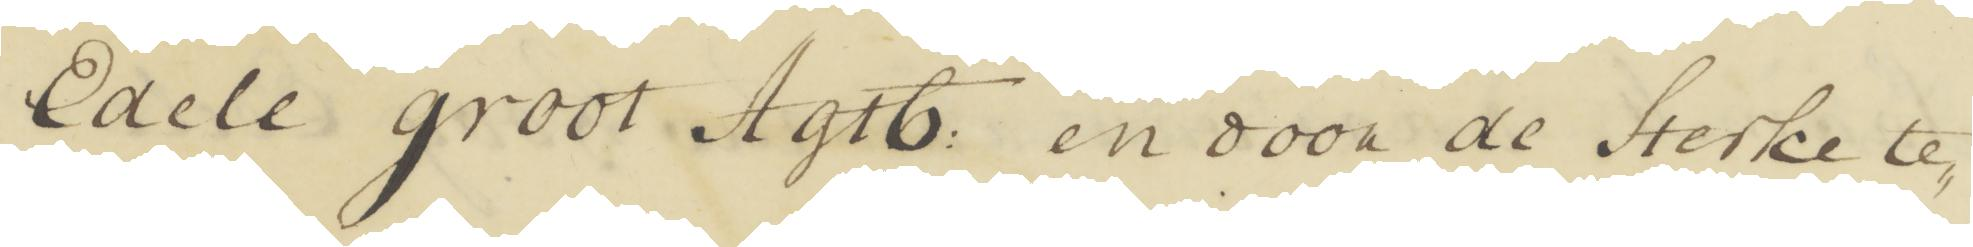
Edele groot Agtb: en door de sterke te„
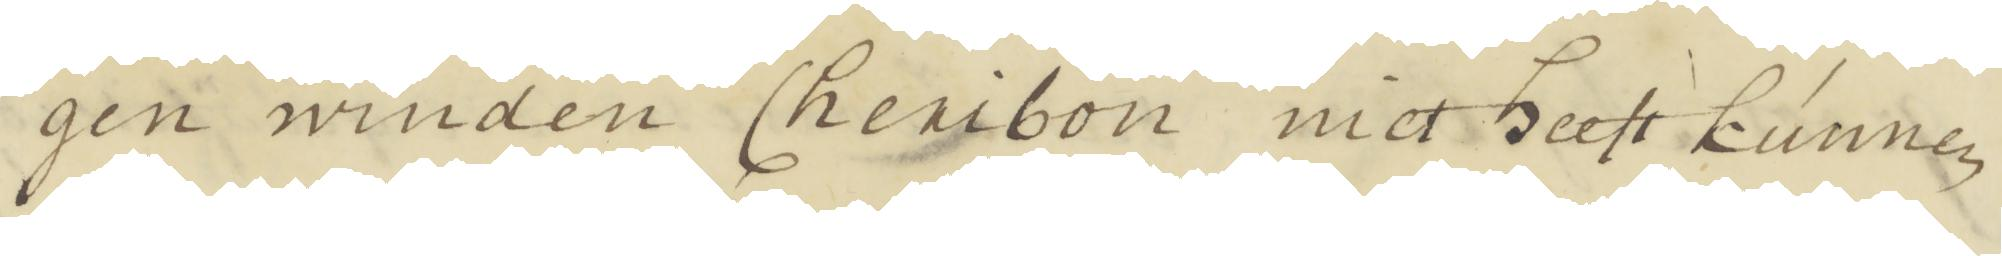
gen winden Cheribon niet heeft kunnen
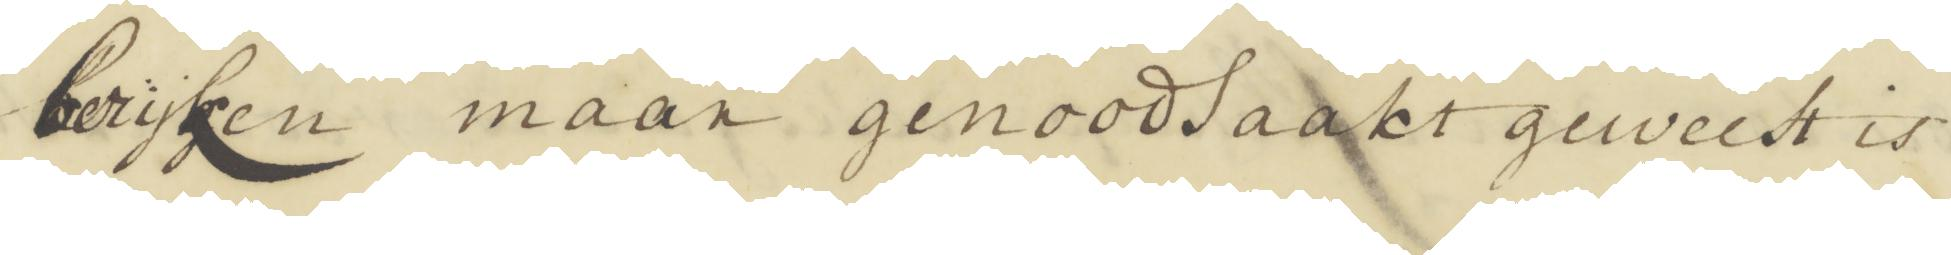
berijken maar genoodsaakt geweest is
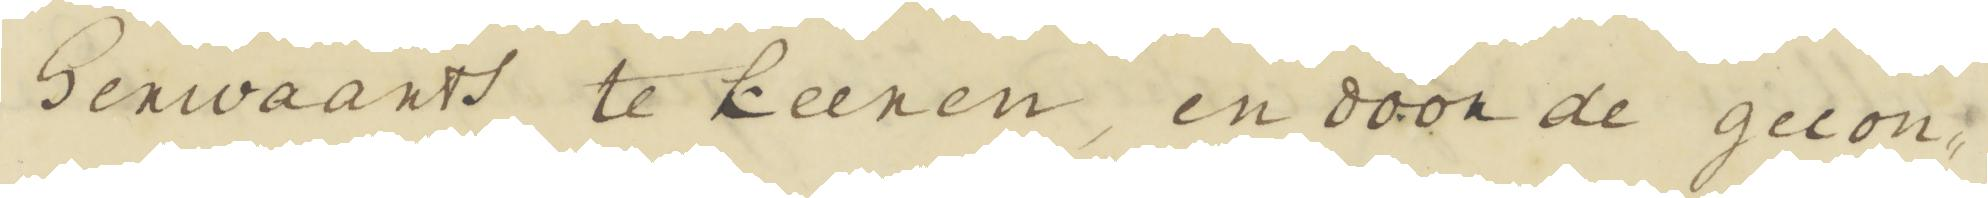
herwaarts te keeren, en door de gecon„
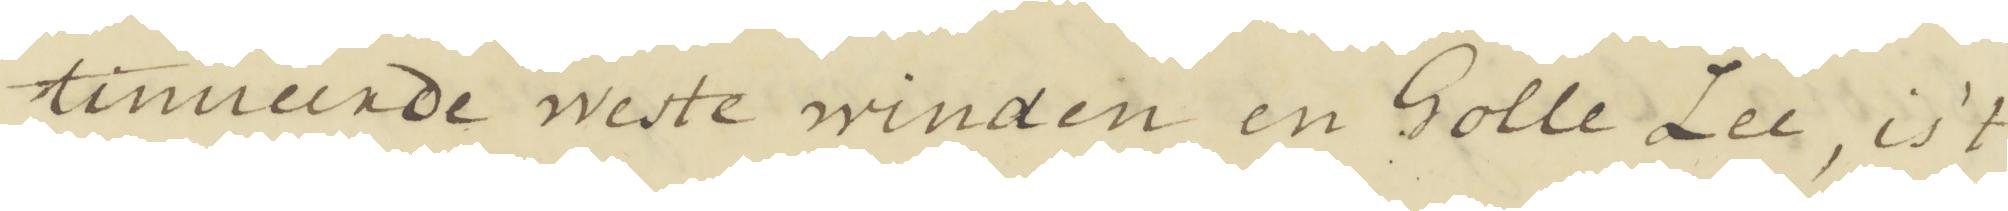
tiuneerde weste winden en holle zee, is't
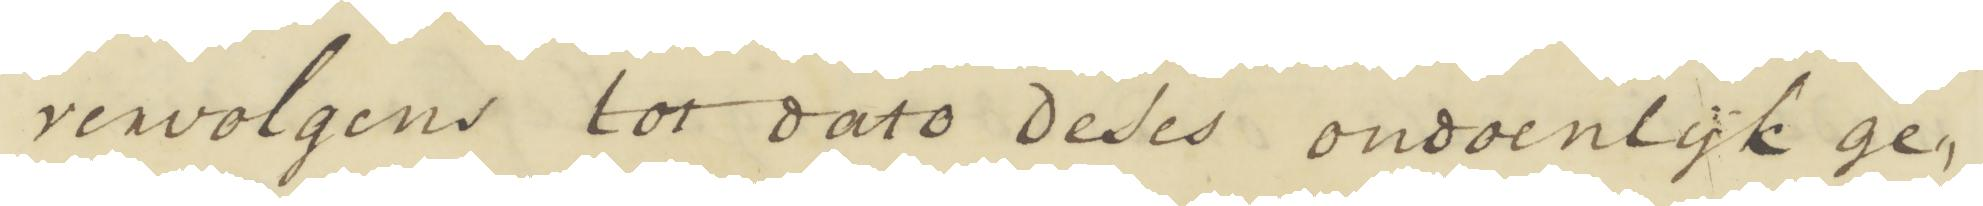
vervolgens tot dato deses ondoenlijk ge„
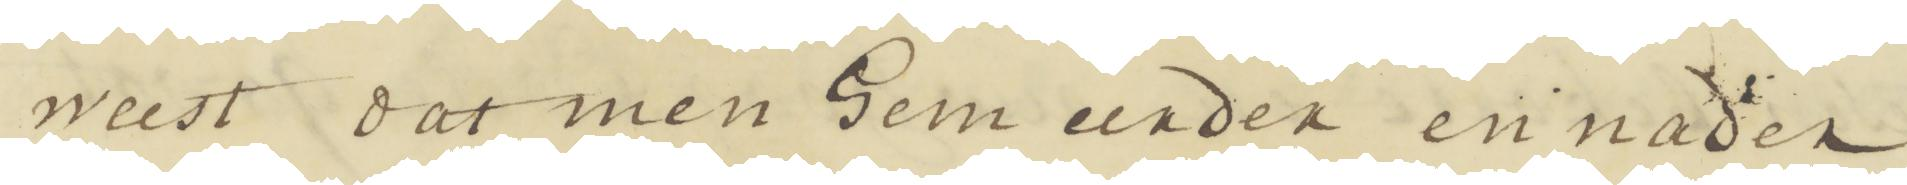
weest dat men hem eerder en nader
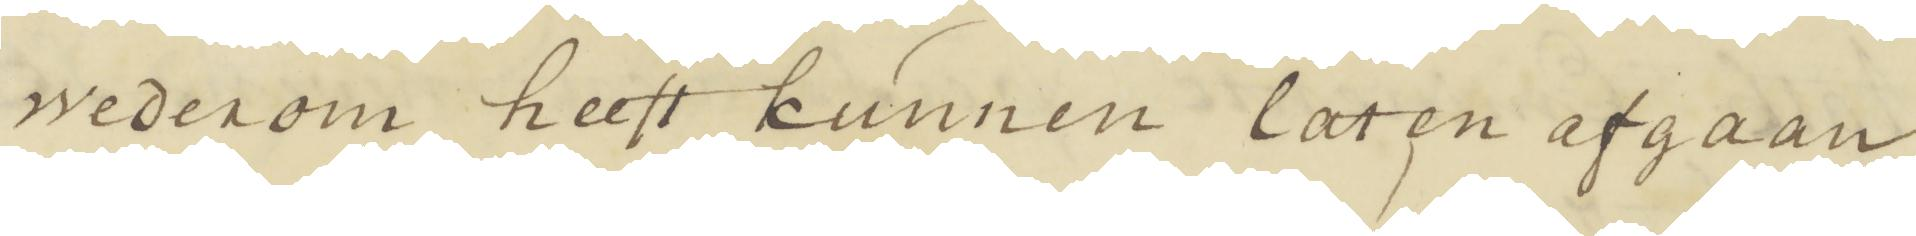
wederom heeft kunnen laten afgaan
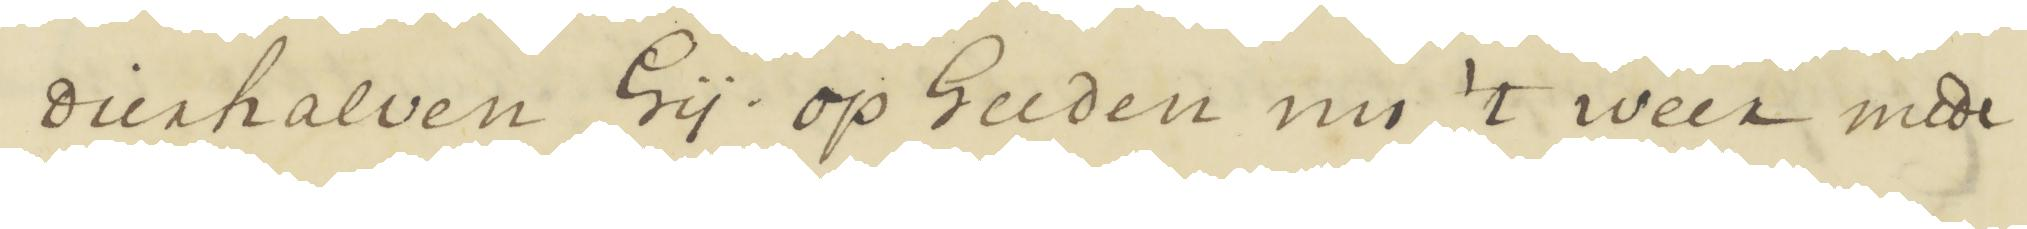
dierhalven hij op heeden nu ’t weer mede
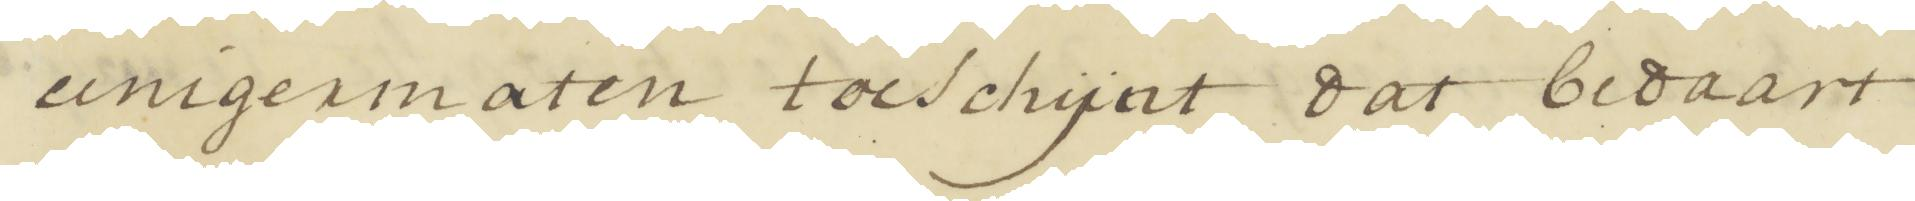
eenigermaten toeschijnt dat bedaart
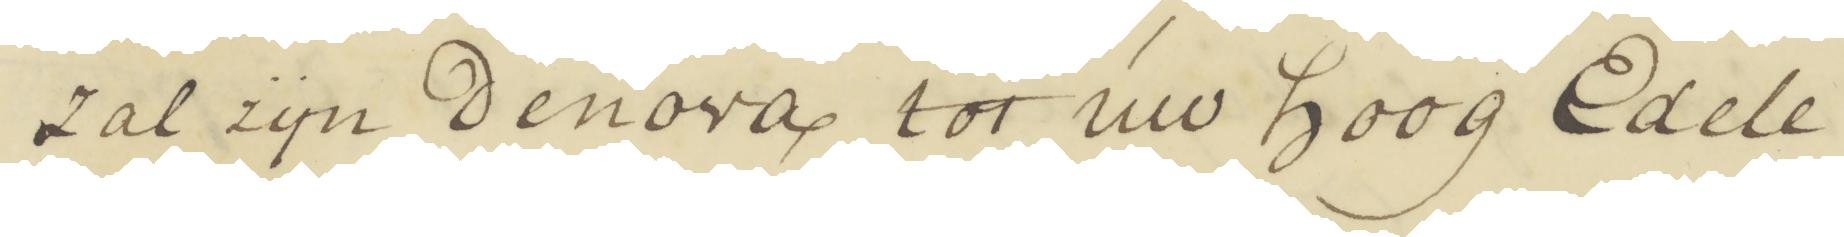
zal zijn denova tot uw Hoog Edele
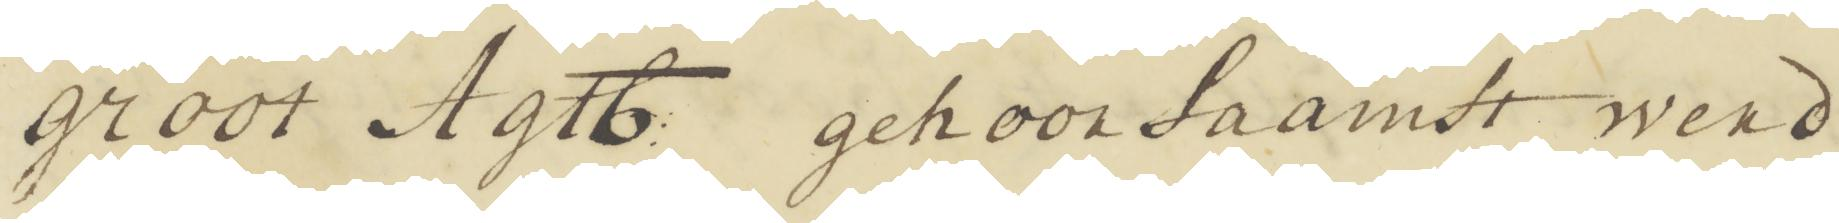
groot Agtb: gehoorsaamst werd
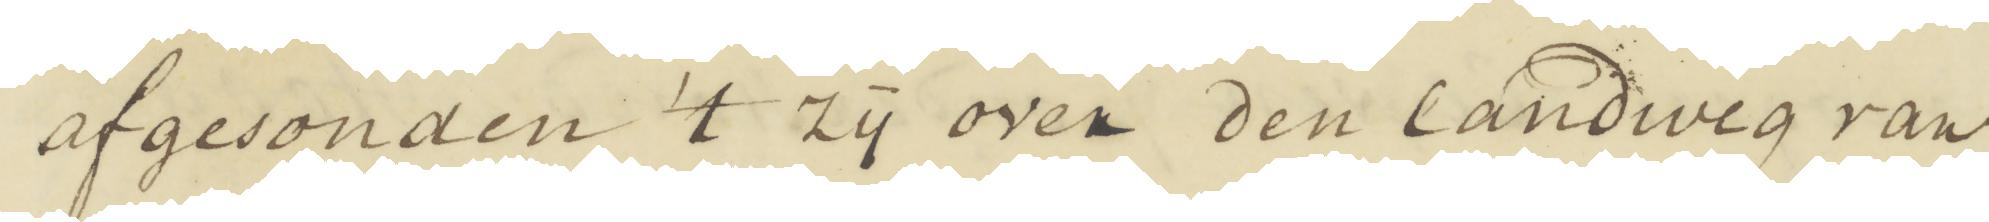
afgesonden ’t zij over den landweg van
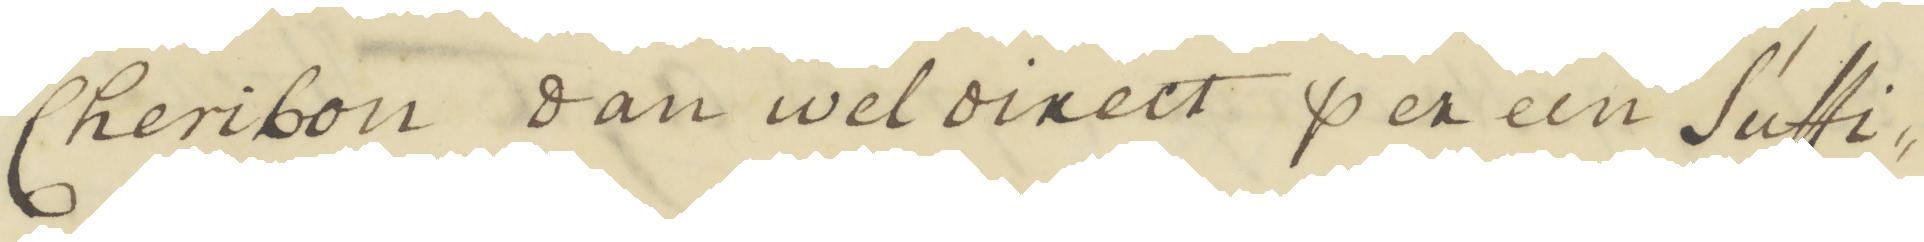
Cheribon dan wel direct per een suffi„
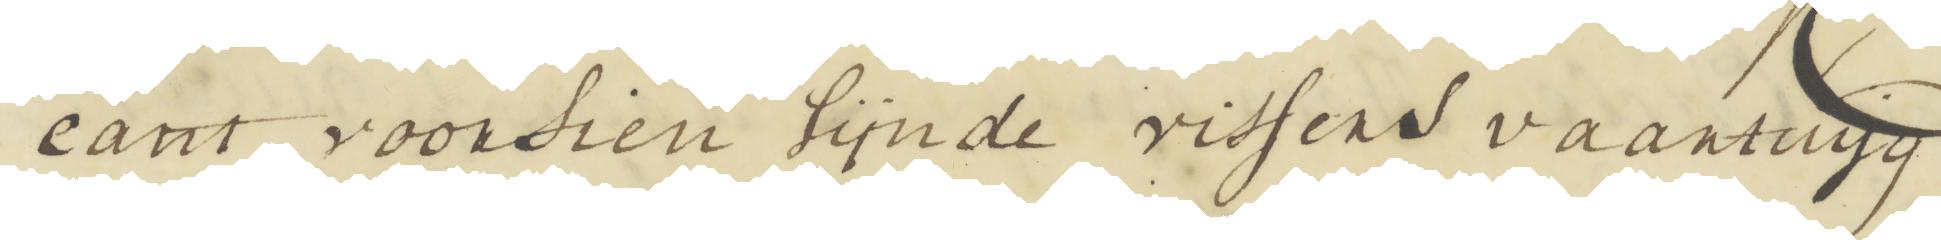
cant voorsien sijnde vissers vaartuijg
